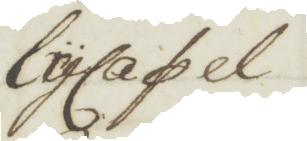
lijcapel
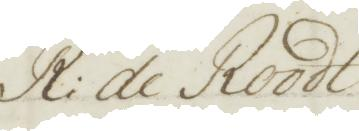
R: de Roodt
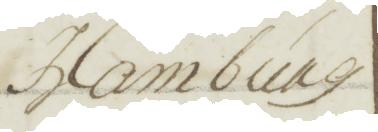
Hamburg
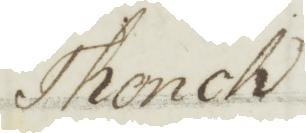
Thonch
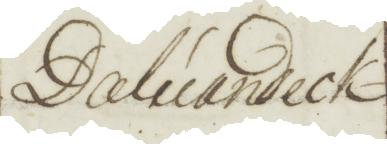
Dalurndeck
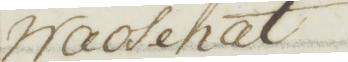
waosehat
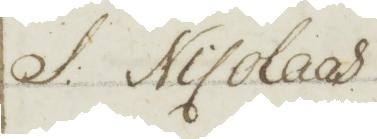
S: Nicolaas
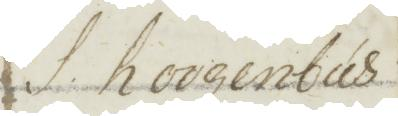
S: hoogenbus
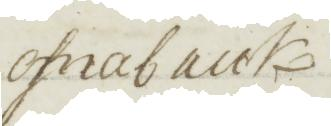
osnabruck
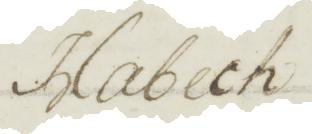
Habech
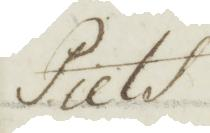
Piets
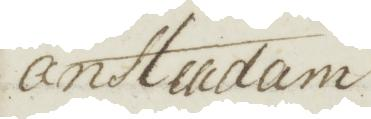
ansterdam
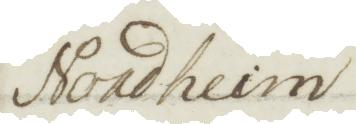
Nordheim
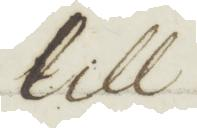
lill
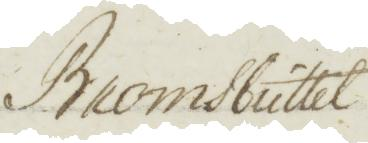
Bromsbuttel
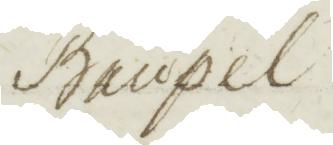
Brupel
